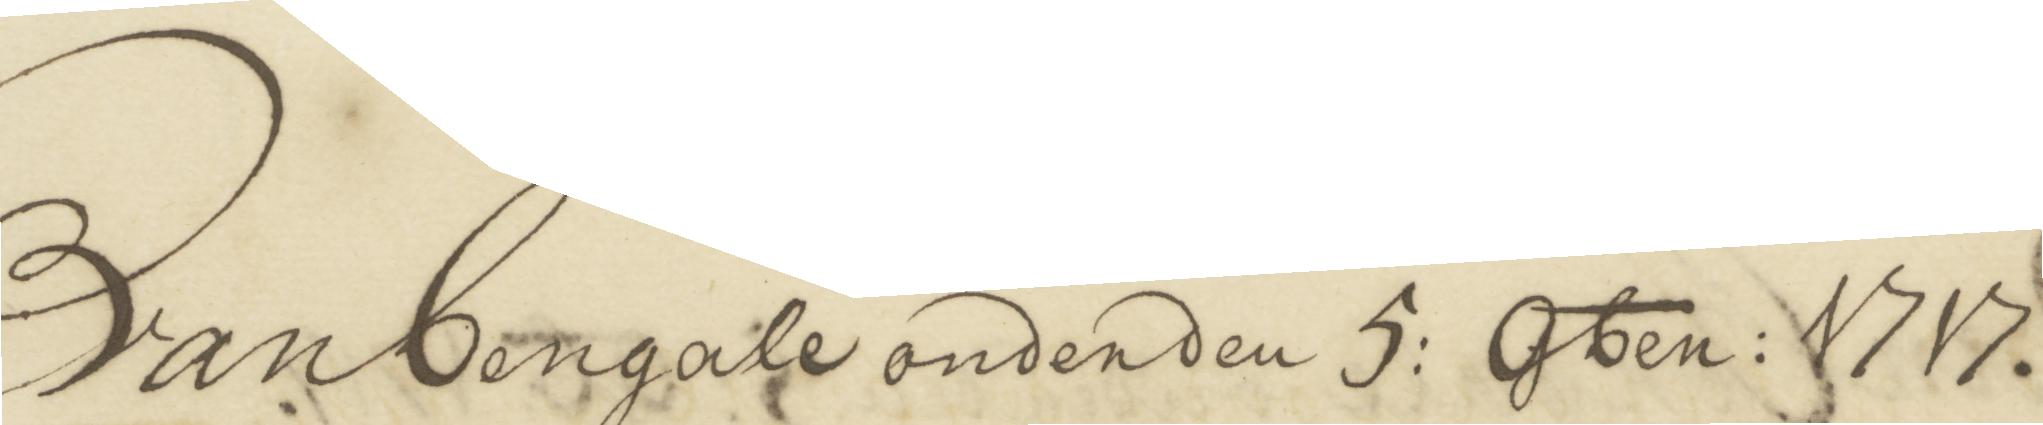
Van bengale onder den 5: 9ber: 1717.
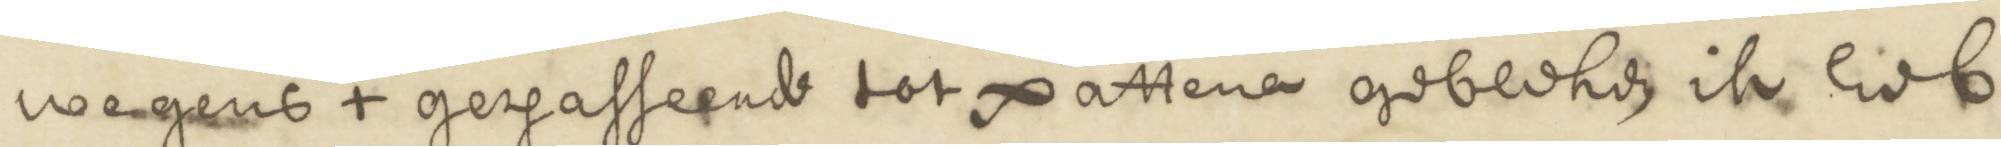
wegens 't gepasseerde tot pattena gebleken ik heb
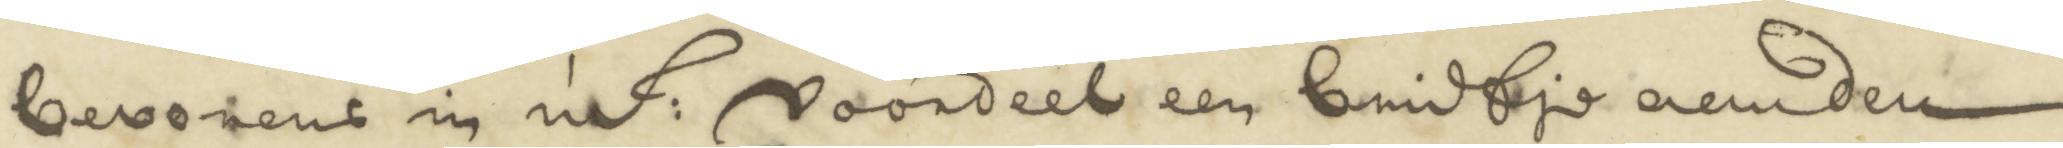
bevorens in uE: voordeel een briefje aan den
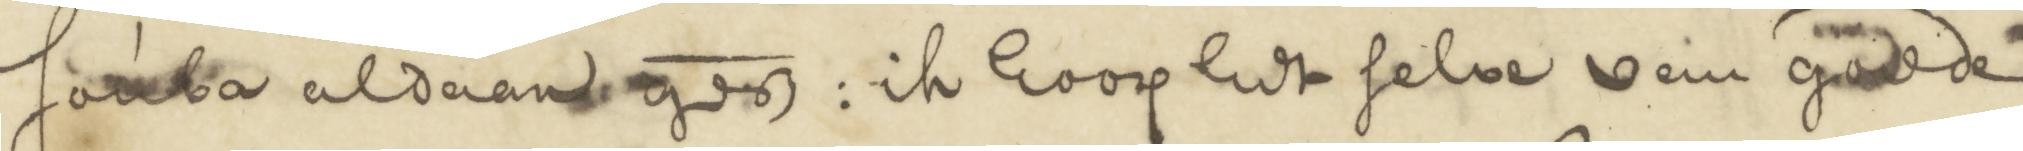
souba aldaar gesz: ik hoop het selve van goede
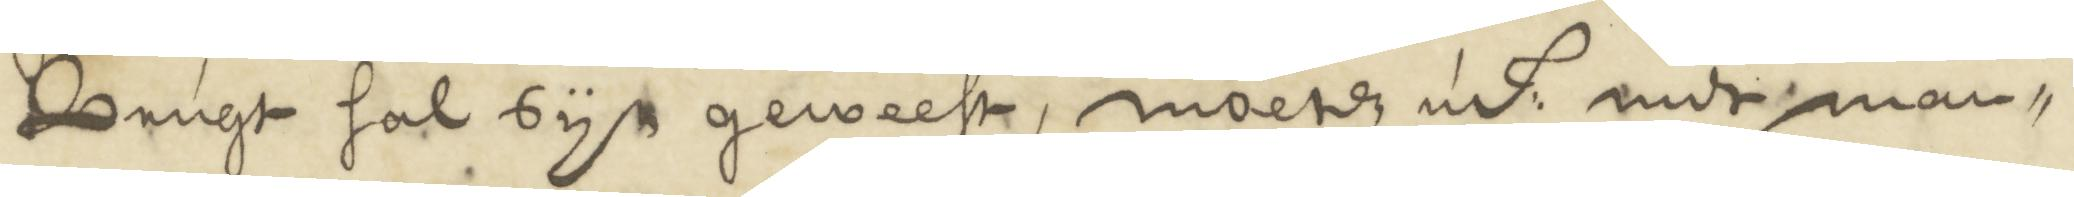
vrugt sal sij geweest, moeten uE: niet man„
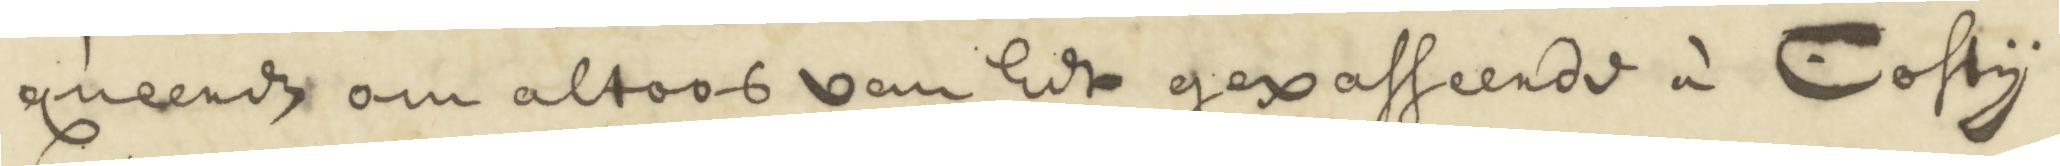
queeren om altoos van het gepasseerde à Costij
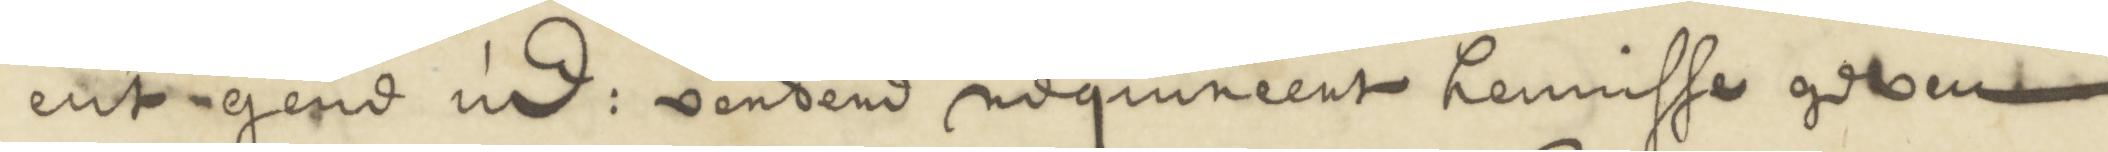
en't gene uE: verdere requireert kennisse geven
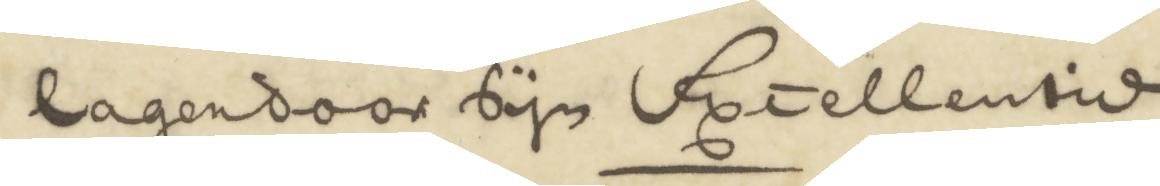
lager door sijn Excellentie
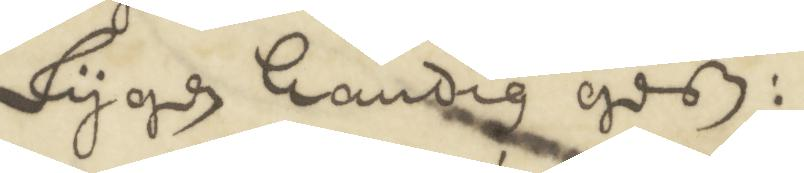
Eijgen handig gesz:
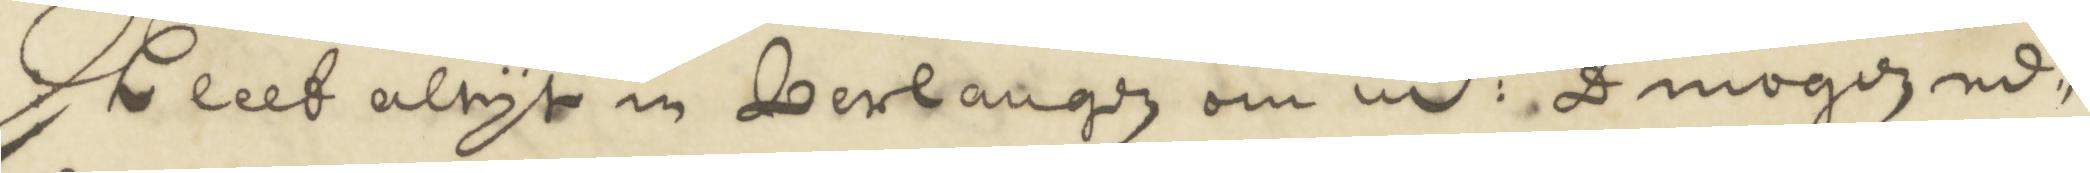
Jk leef altijt in verlangen om uE: te mogen re„
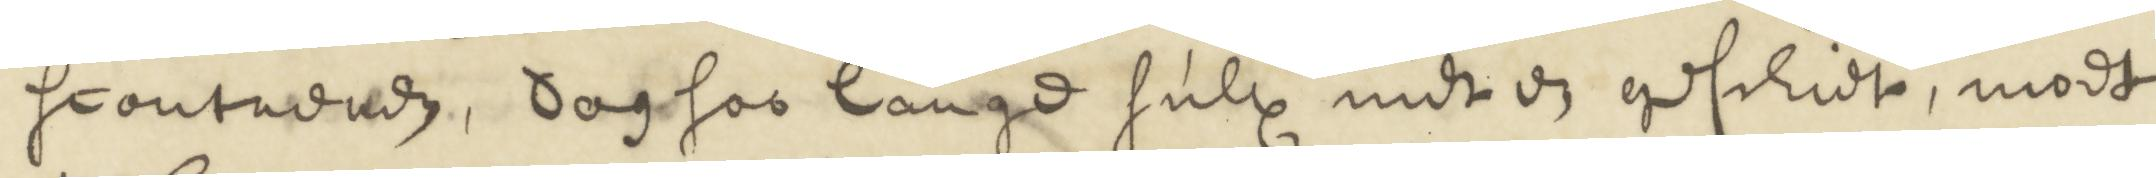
scontrenen, dog soo lange sulx niet en geschiet, moet
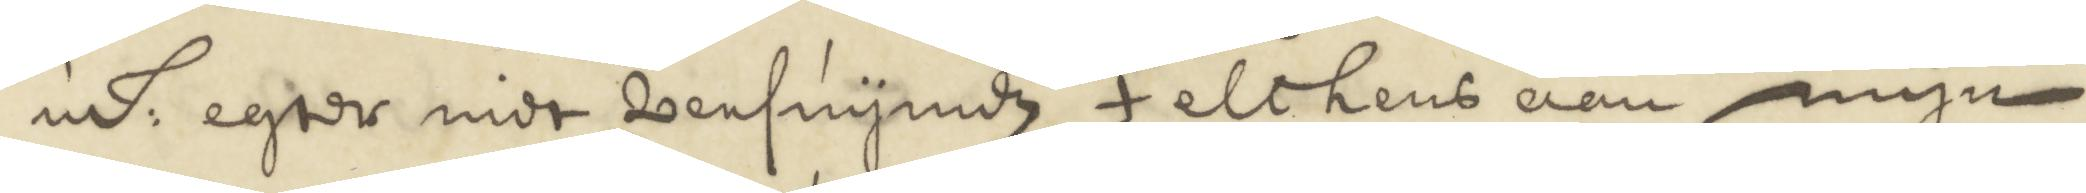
uE: egter niet versuijmen 't elckens aan mijn
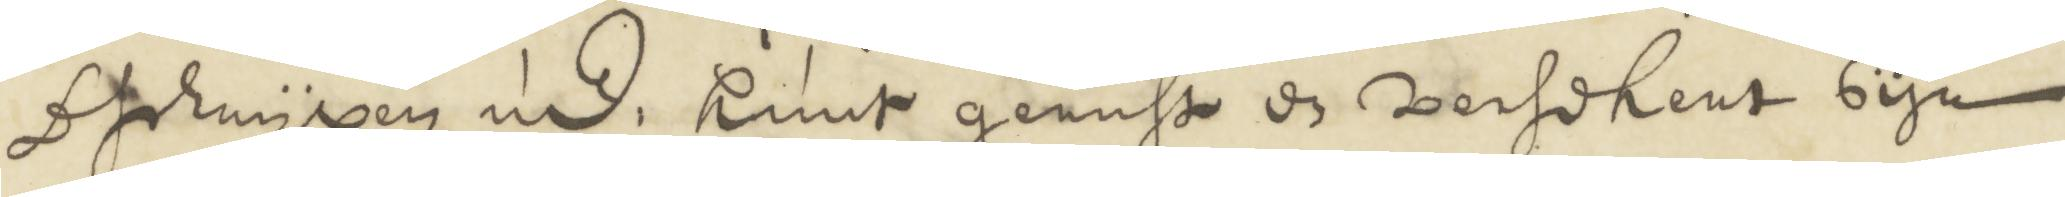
te schrijven uE: kunt gerust en versekert sijn
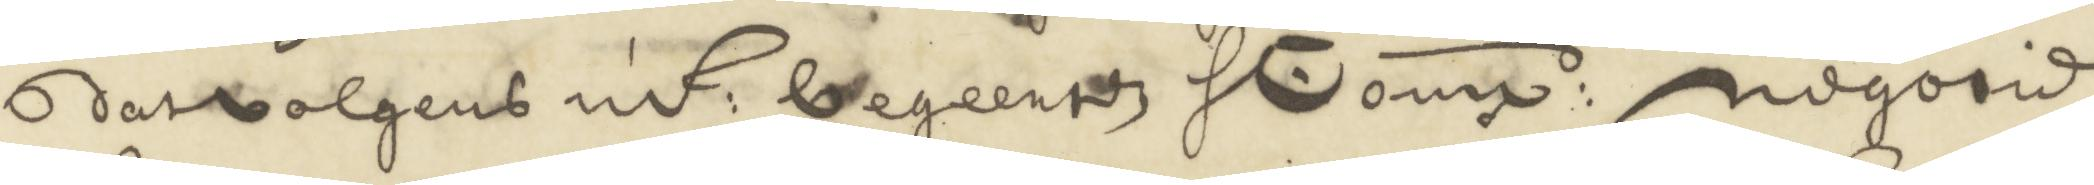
dat volgens uE: begeerten sComp:s negotie
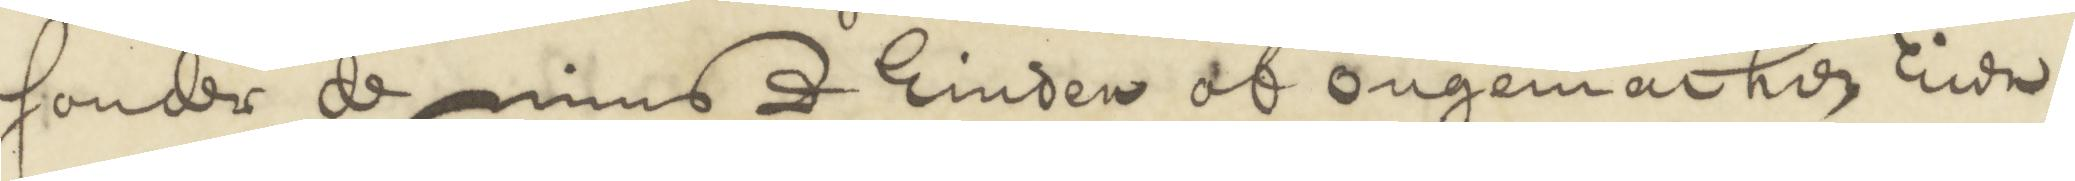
sonder de minste hinder of ongemacken hier
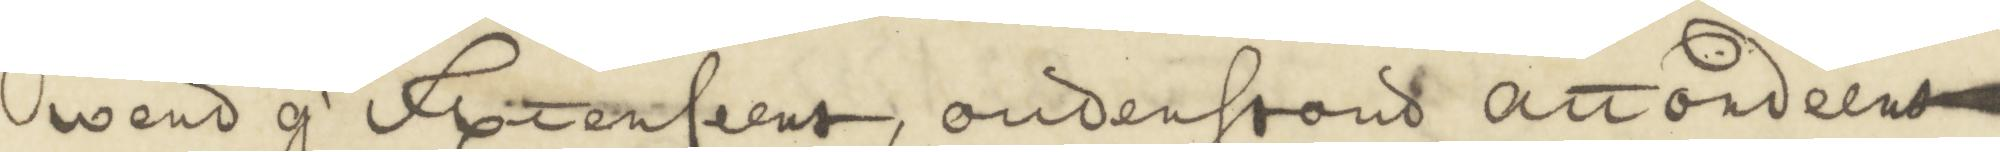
werd g’Excerseert, onderstond accordeert
